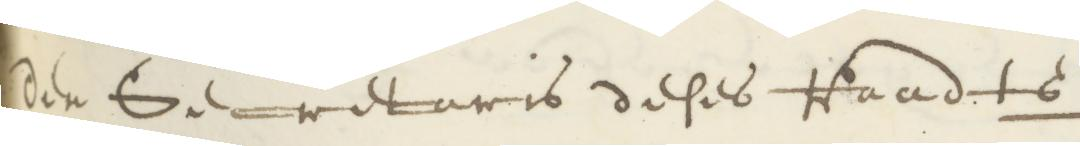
der Secretaris deses Raadts
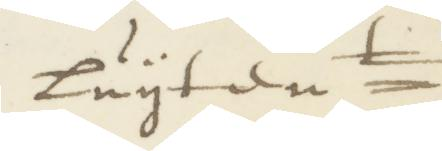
Luijten=t
